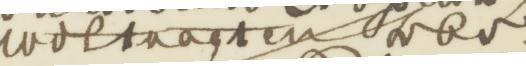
wel tragten te be
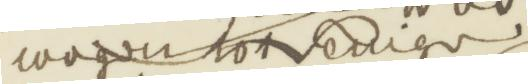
wegen tot Eenige
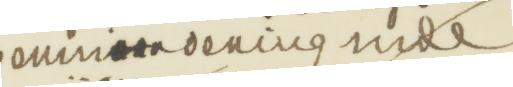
vermindering inde
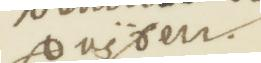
prijsen.
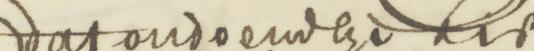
dat ondoenelyck is
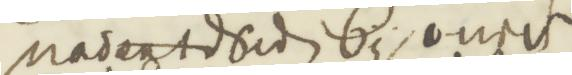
nader te sien bij onzes
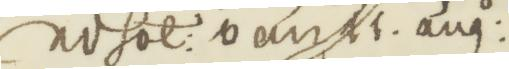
resol: van 11. aug:
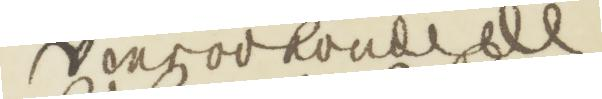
versoekende de
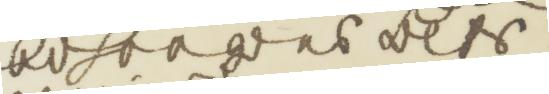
besorgers telts
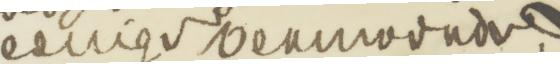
eenige vermeerde
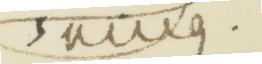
ring.
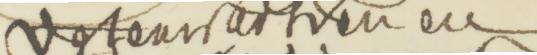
Egter is het Een en
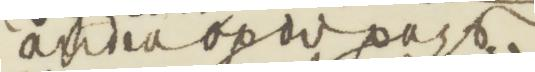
ander op de prys
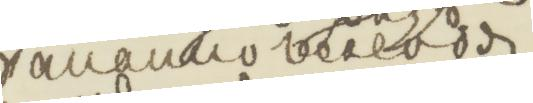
van anno verleden
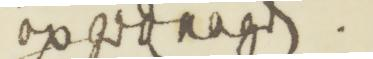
opgedragen.
